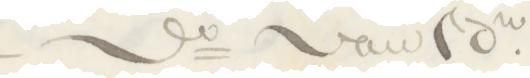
D=o van 5 d„m
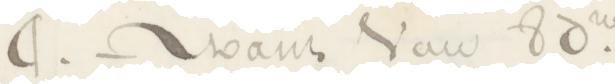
4. want van 8 d„m
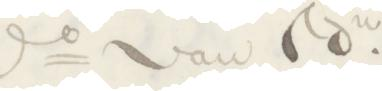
3 D=o van 5 d„m
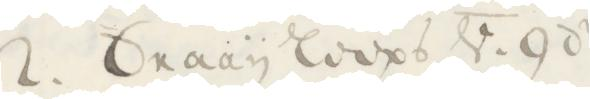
2. draaij reeps v. 9 d„m
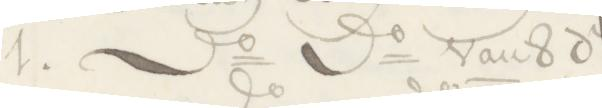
1. D=o D=o van 8 d„m
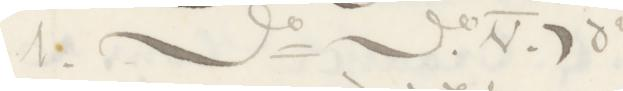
1. D=o D=o v. 7 d„m
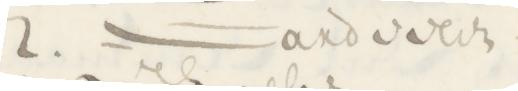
2. cardeelen
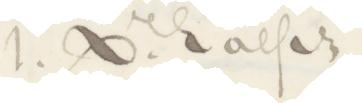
1. p„r halsen
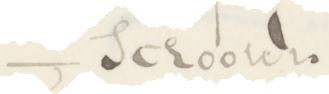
schooren
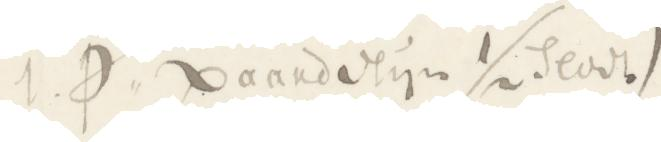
1. P„ paardelijn ½ sleet
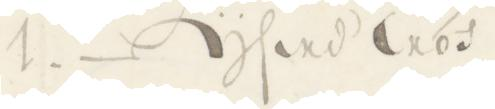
1. ijsere tros
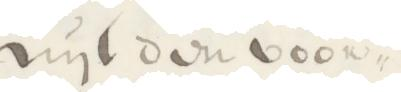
uijt den voor„
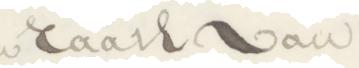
raath van
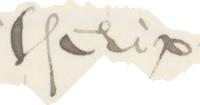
’t schip
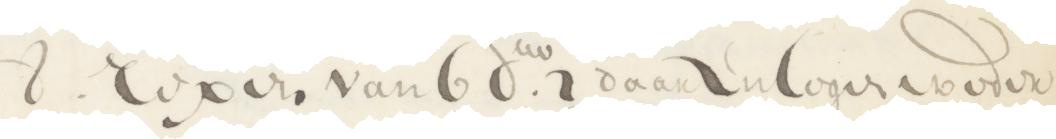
8. repen van 6 d:m 2 daar entegen weder
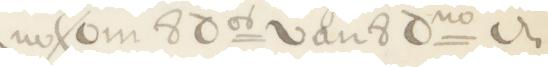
m om 8 d=os van 8 d=m en
